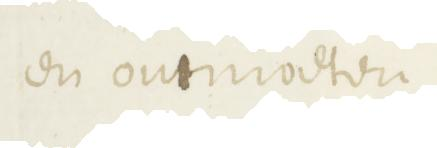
en ontmoeten
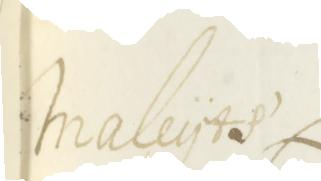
maleijtse
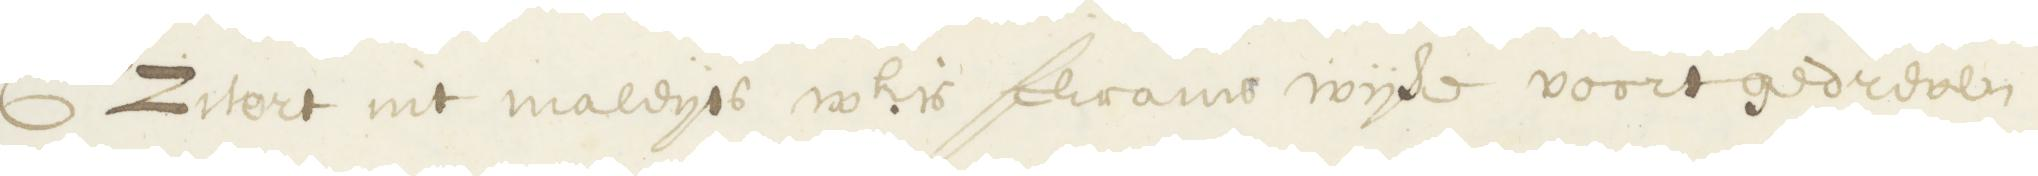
C Zitort int maleijts w:k is schrams wijse voort gedreven
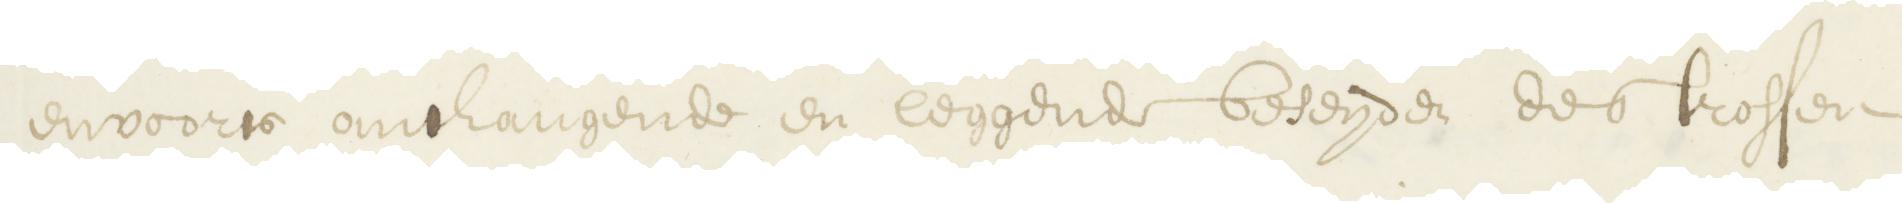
en voorts omthangende en leggende beseyden destrossen
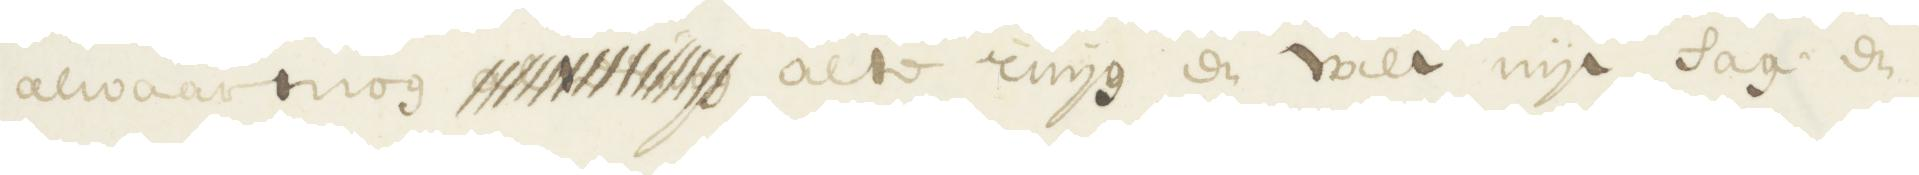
alwaar tnog alleringe alte ruijg en wilt uijt sag en
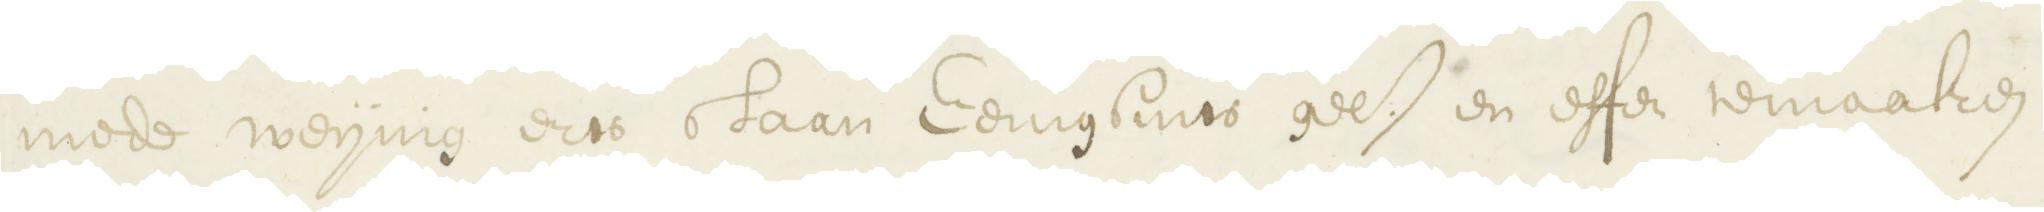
mede weijnig erts staan Eenigsints gelijk en effen temaaken
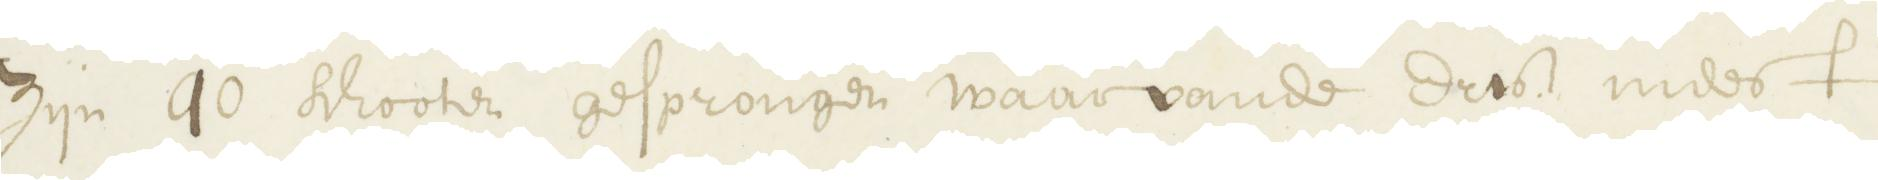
Zijn 40 schooten gesprongen waar vande Erts meest
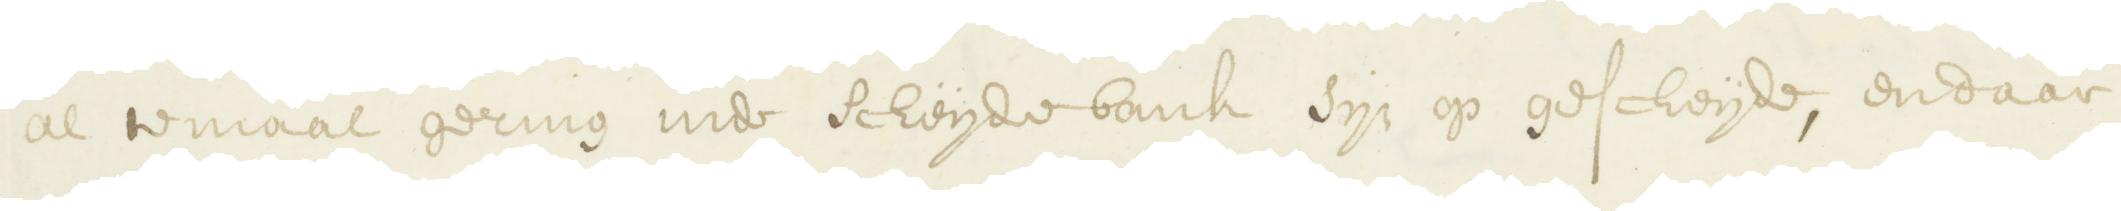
al temaal gering inde scheijde bank sijn op gescheijde, en daar
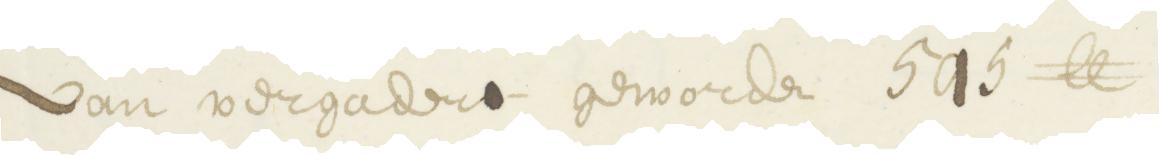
van vergadert geworden 543 lb:
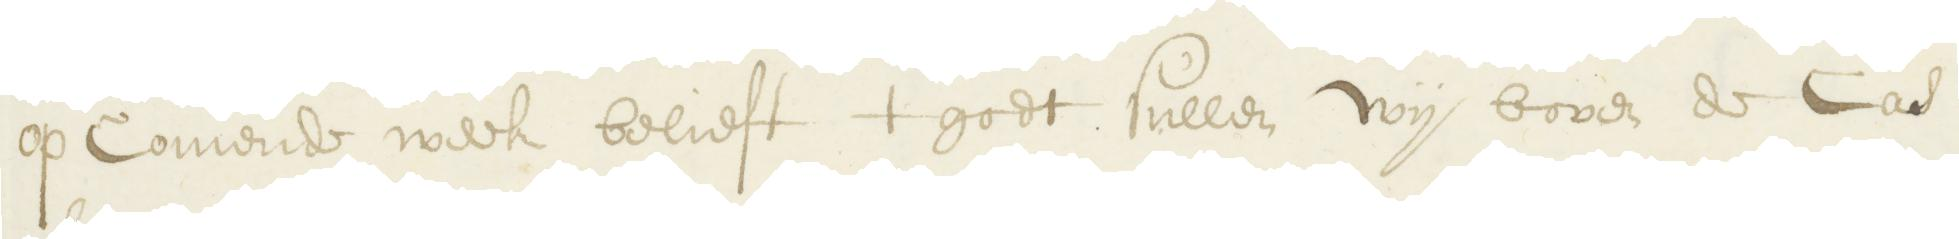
op Comende week belieft t godt sullen wij boven de Cas
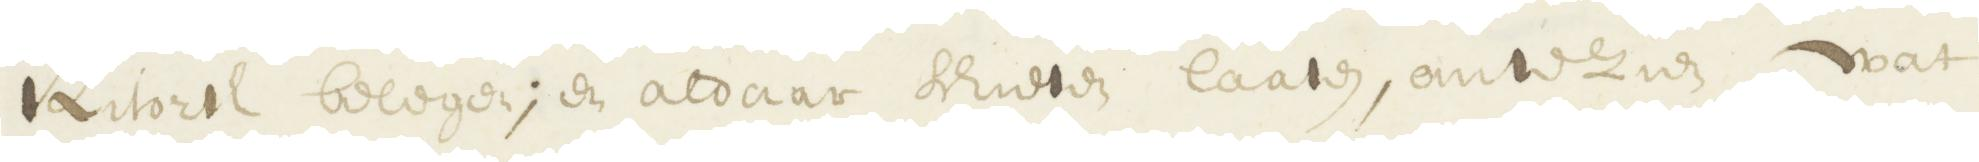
tZitorth belegen; en aldaar schieten laaten, omte zien wat
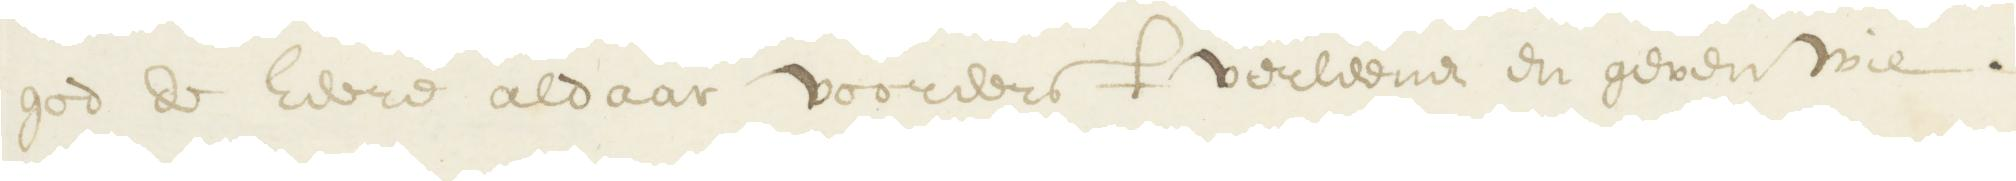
god de heere aldaar vooreerst verleenen en geven wil
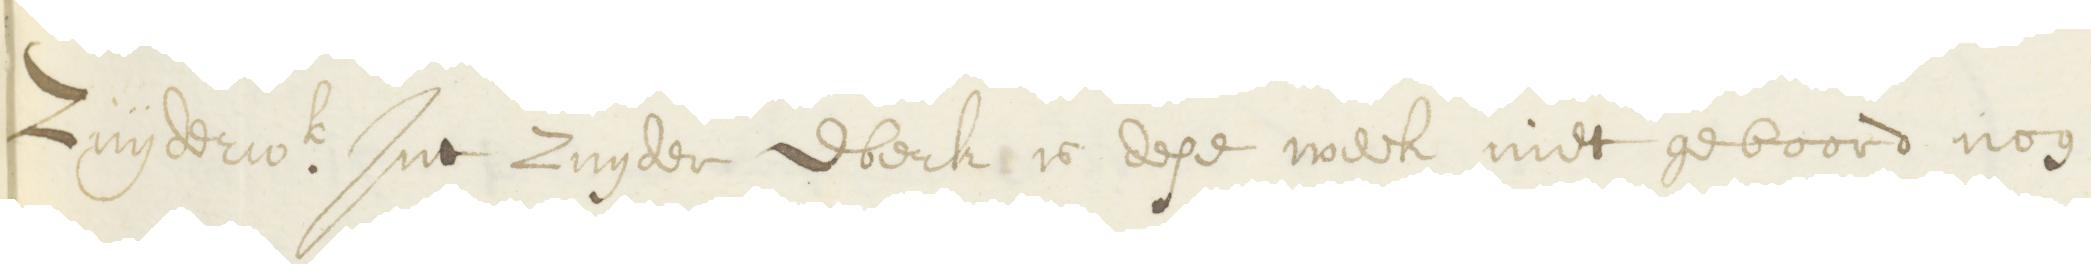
Zuijderw:k Jnt Zuyder werk is dese week niet geboord nog
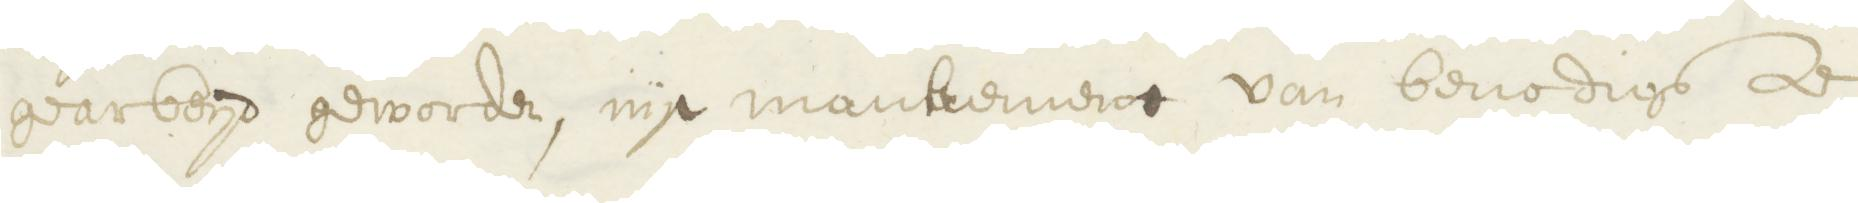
gearbeyd geworden, uijt mankement van benodigste
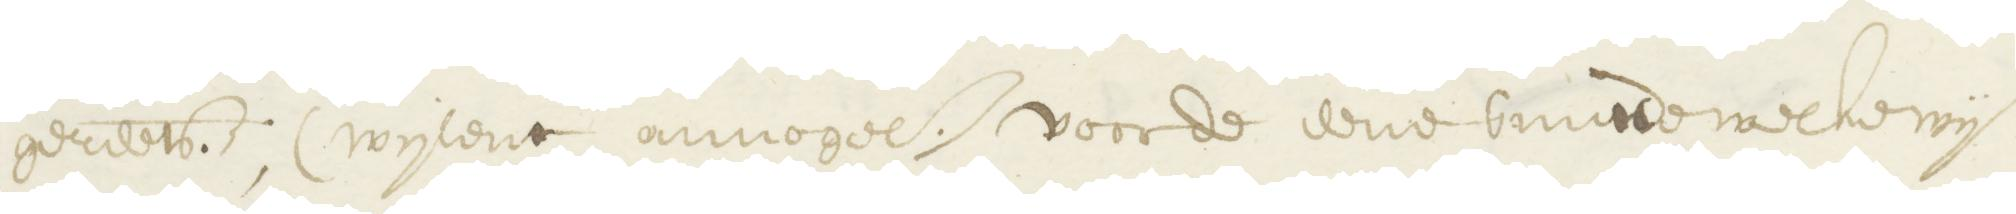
gereets. ; (wylent onnogelijk voorde eene smit dewelke wij
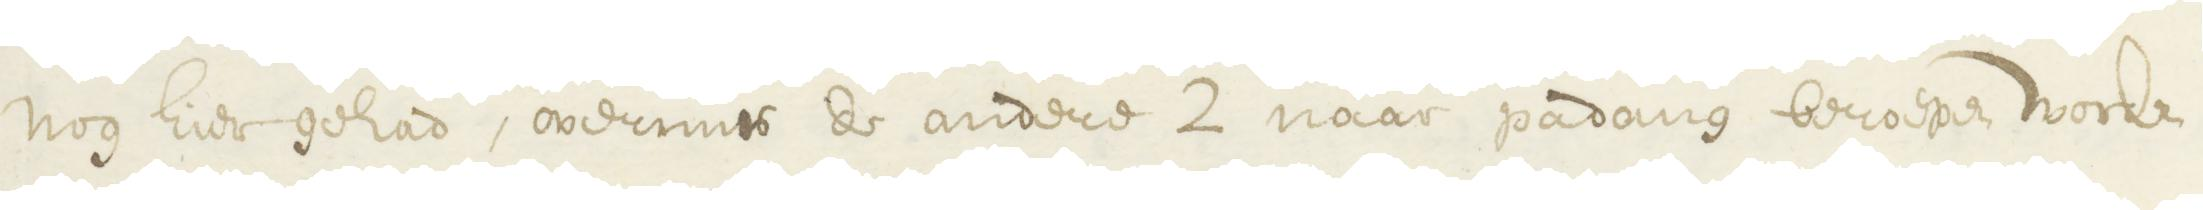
nog hier gehad, overmits de andere 2 naar padang beroepen worden
